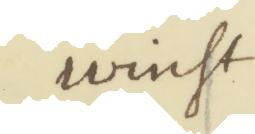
winst
